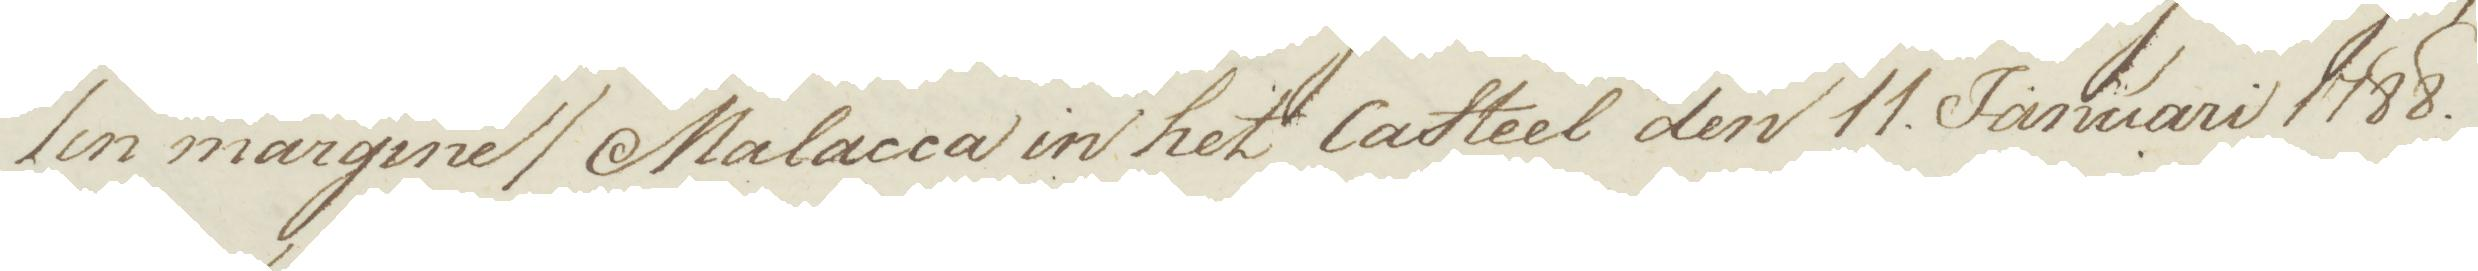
/ in margine/ Malacca in het Casteel den 11. Ianuari 1788.
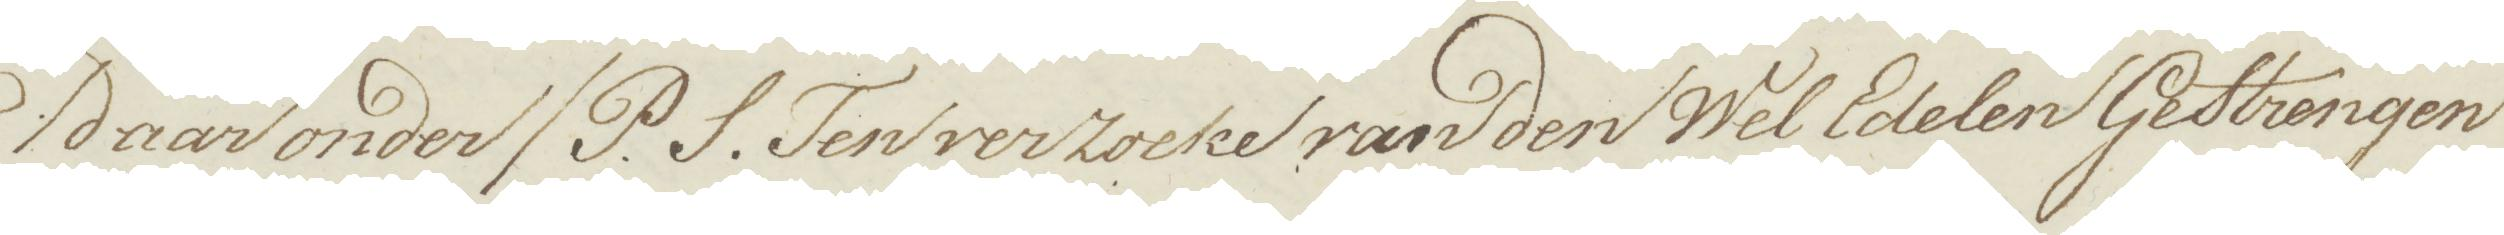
/daar onder/ P. S. Ten verzoeke van den Wel Edelen Gestrengen
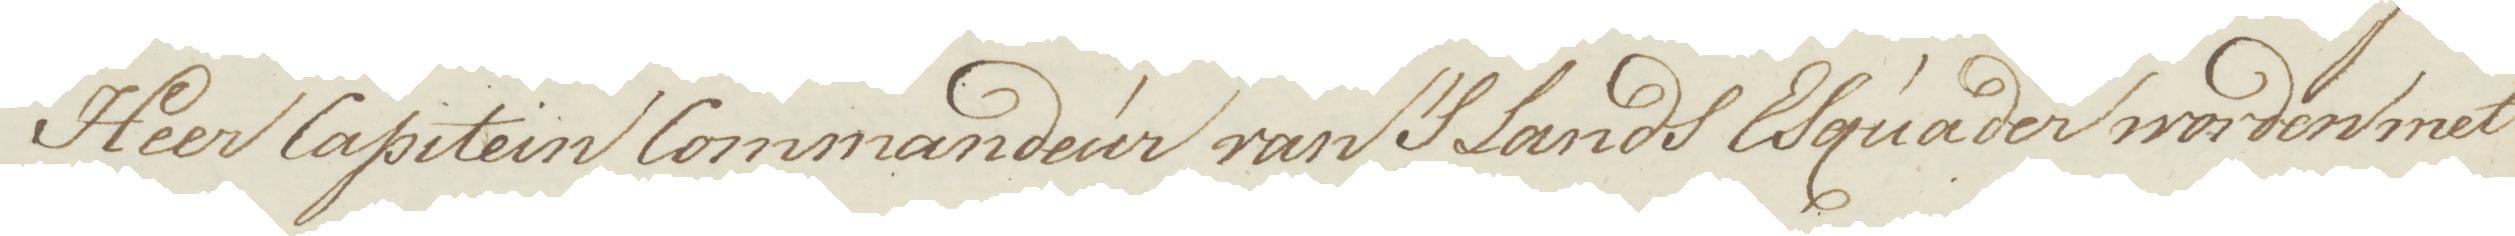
Heer Capitein Commandeur van 'S lands Esquader worden met
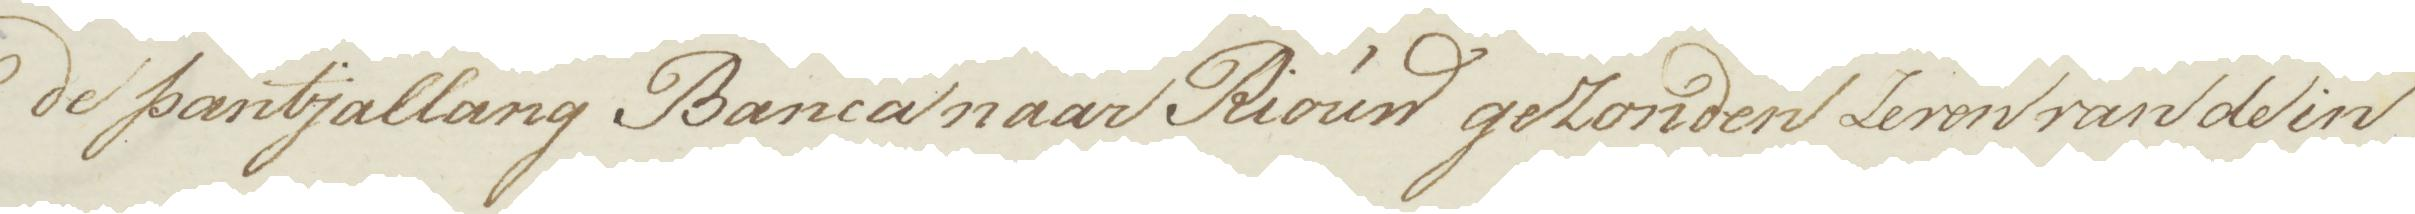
de pantjallang Banca naar Riouw gezonden Zeven van de in
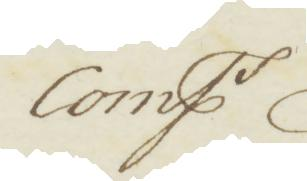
Comp:s
